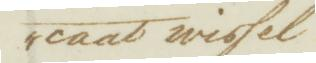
„caat wissel
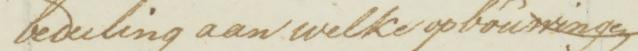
bedeeling aan welke opbouwingen
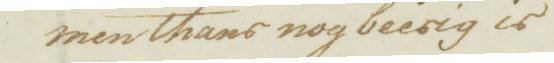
men thans nog beesig is
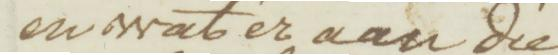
en wat 'er aan die
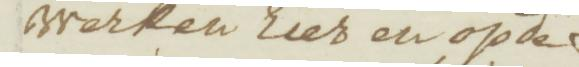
werken hier en op de
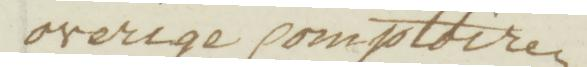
overige Comptoiren
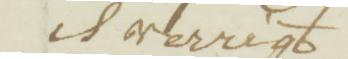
is verrigt
